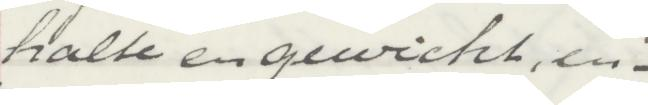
halte en gewicht, en
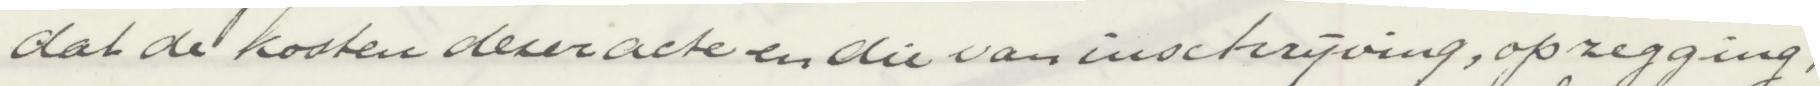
dat de kosten dezer acte en die van inschrijving, opzegging,
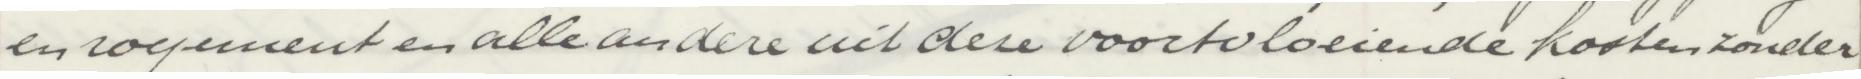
en royement en alle andere uit deze voortvloeiende kosten zonder
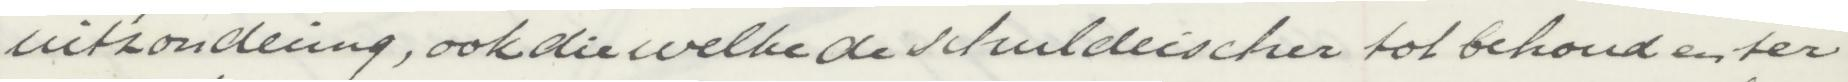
uitzondering, ook die welke de schuldeischer tot behoud en ter
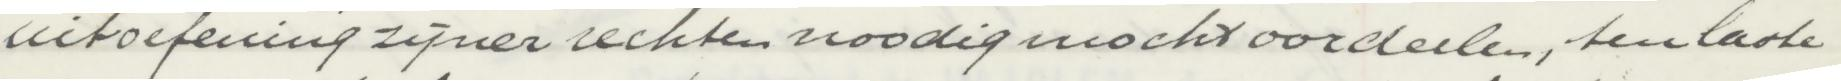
uitoefening zijner rechten noodig mocht oordeelen, ten laste
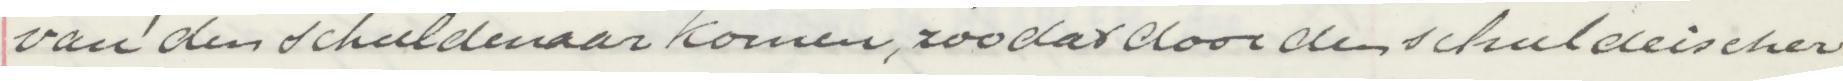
van den schuldenaar komen, zoo dat door de schuldeischer
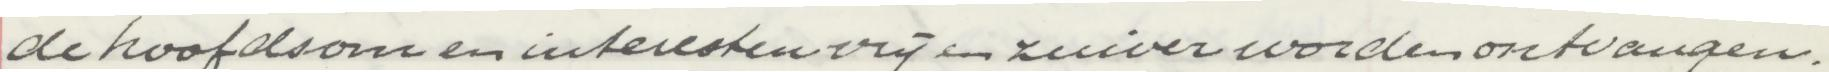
de hoofdsom en interesten vrij en zuiver worden ontvangen.
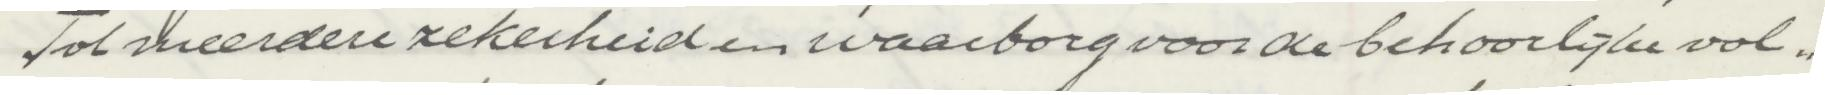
Tot meerdere zekerheid en waarborg voor de behoorlijke vol„
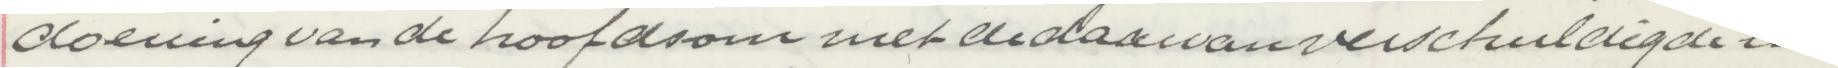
doening van de hoofdsom met de daarvan verschuldigde in-
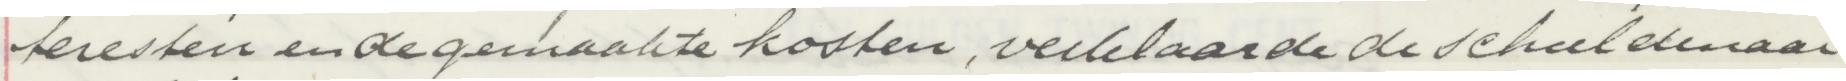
teresten en de gemaakte kosten, verklaarde de schuldenaar
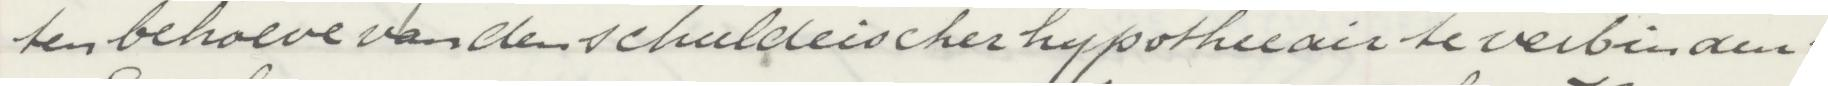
ten behoeve van den schuldeischer hypothecair te verbinden:
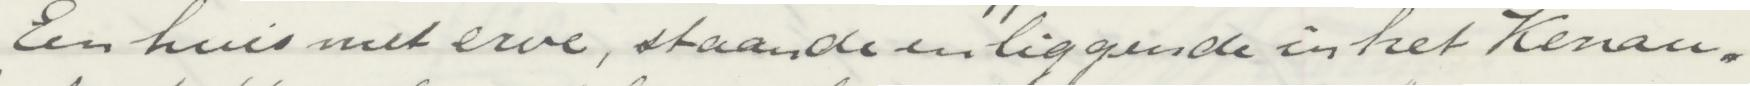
Een huis met erve, staande en liggende in het Kenau„
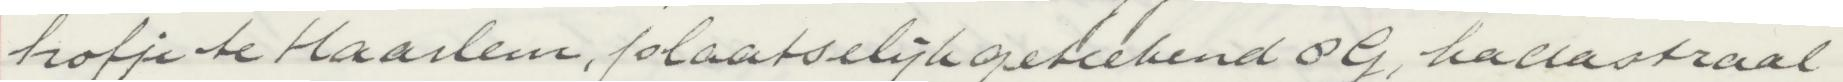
hofje te Haarlem, plaatselijk geteekend 8 G, kalastraal
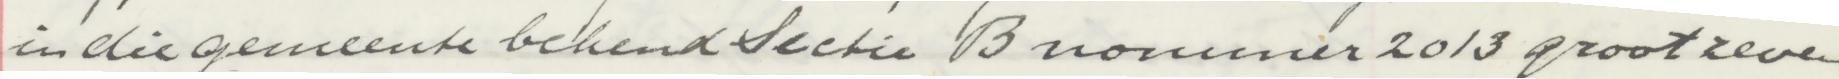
in die gemeente bekend sectie B nommer 2013 groot zeven
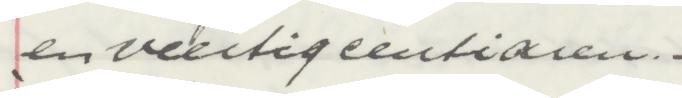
en veertig centiaren.
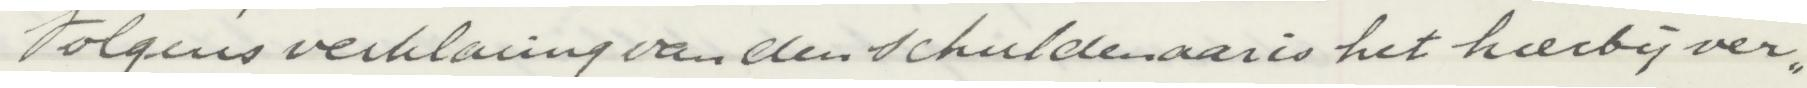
Volgens verklaring van den schuldenaar is het hierbij ver„
